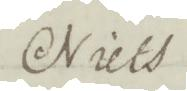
Niets
